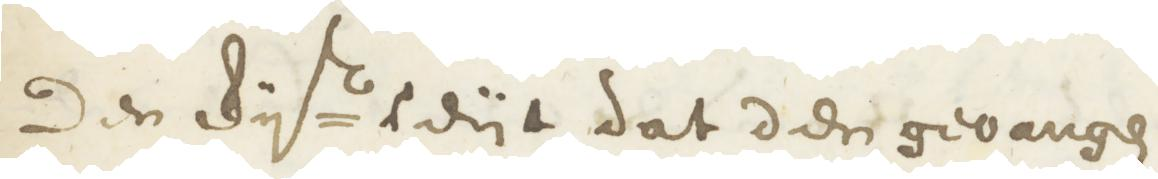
Den Eij=r seijt dat den gevange
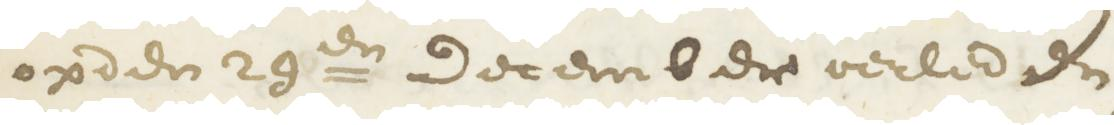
op den 29=en December verleden
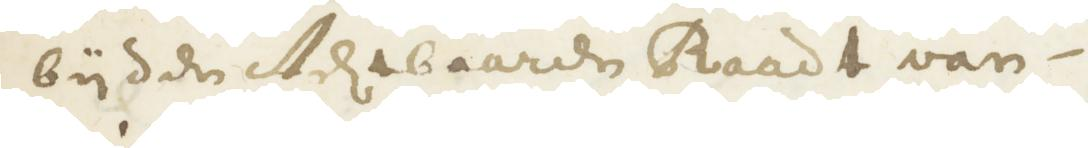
bij den Achtbaaren Raadt van —
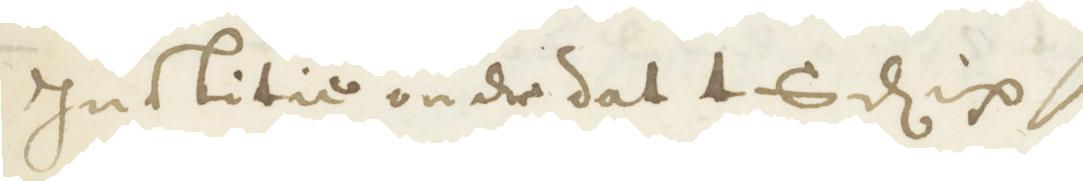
Justitie over dat t Schip
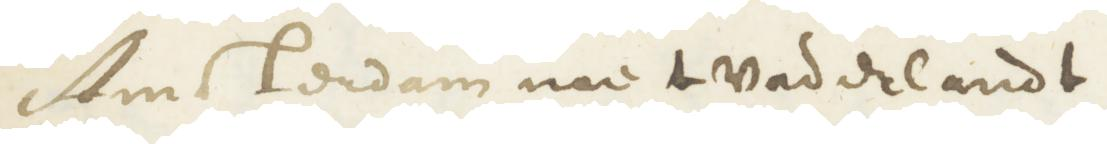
Amsterdam nae t Vaderlandt
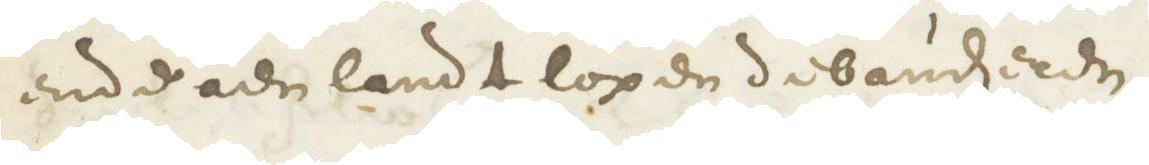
ende aen landt lopen debaucheren
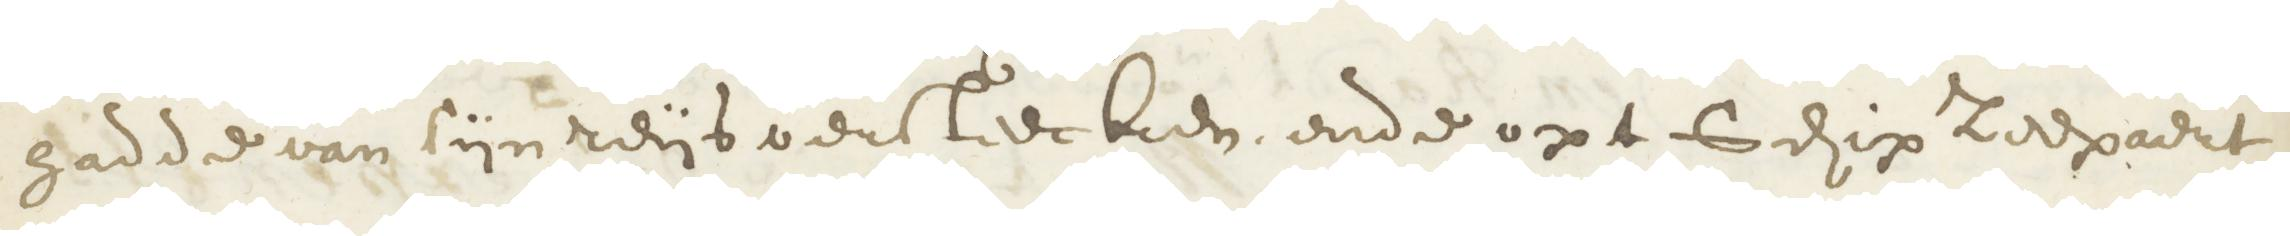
hadde van sijn reijs versteecken, ende op t Schip Zeepaert
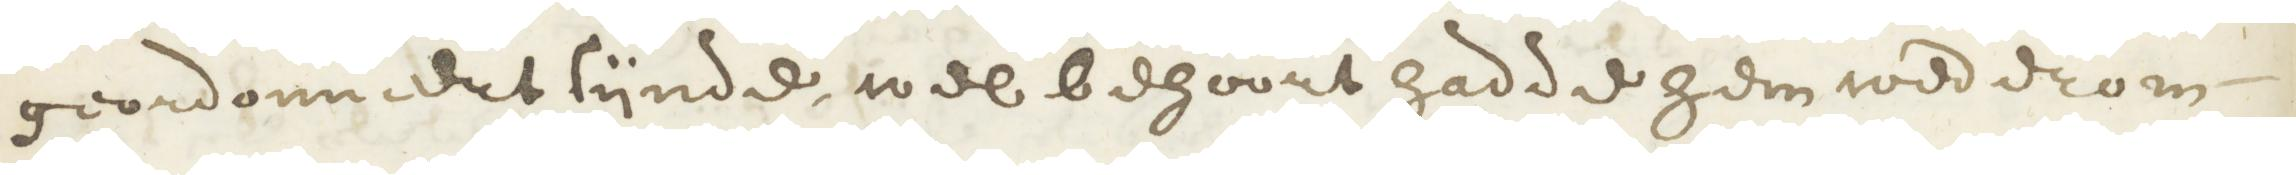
geordonneert Sijnde, wel behoort hadde hem wederom —
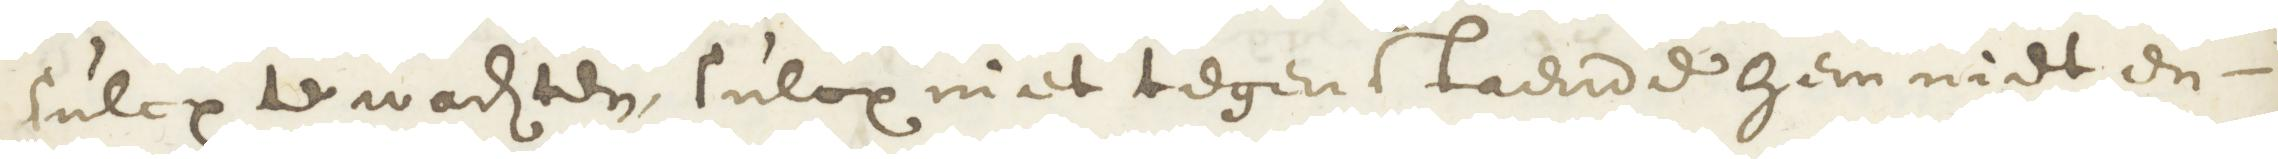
sulcx te wachten, sulcx niet tegenstaende hem niet en —
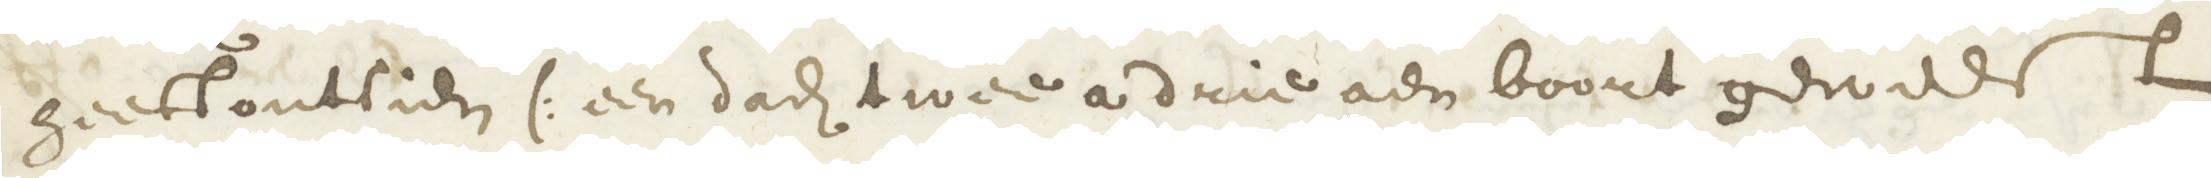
heeft ontsien (:een dach twee a drie aen boort geweest
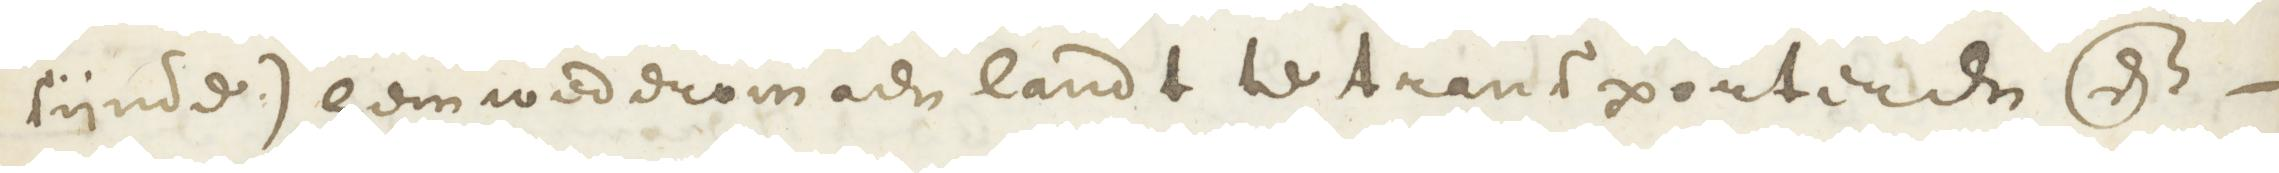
sijnde :) hem wederom aen landt te transporteren ende —
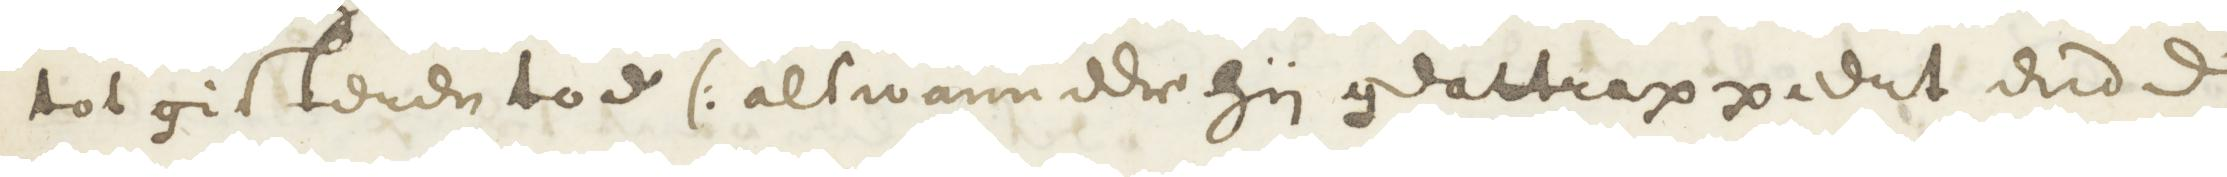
tot gisteren toe (:als wanneer hij geattrappeert ende
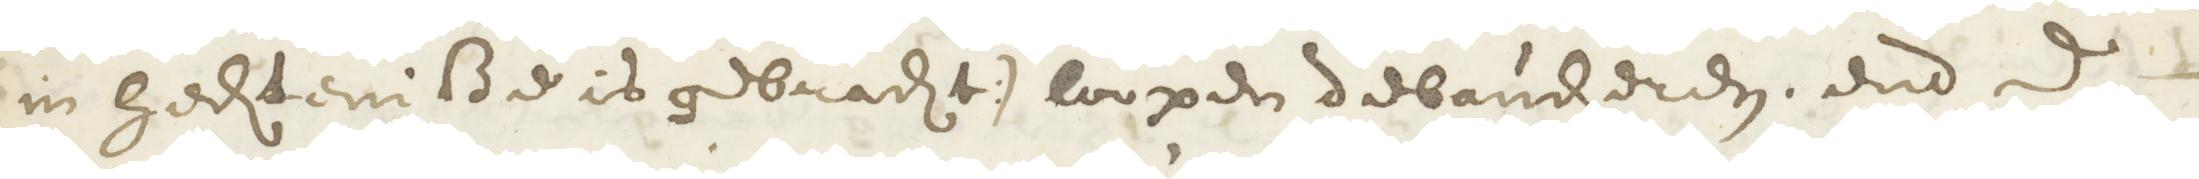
in hechteniꞵe is gebracht:) loopen debaucheren ende —
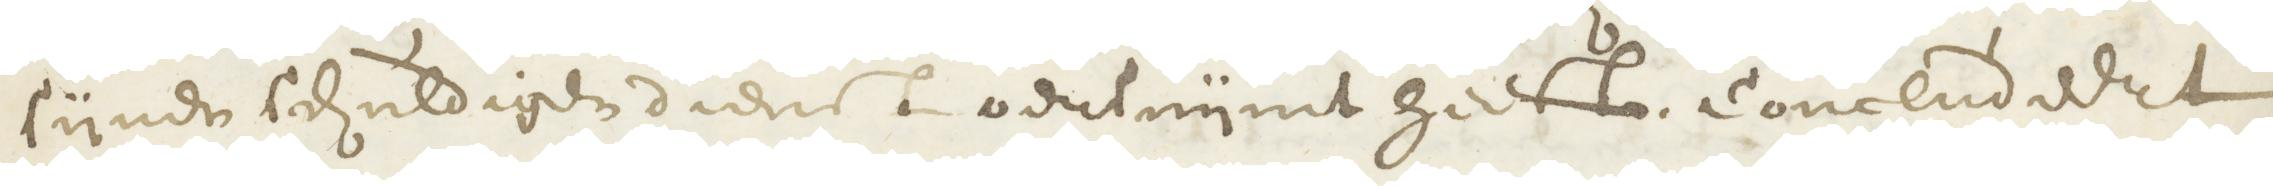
sijnen schuldigen dienst versuijmt heeft. concludeert
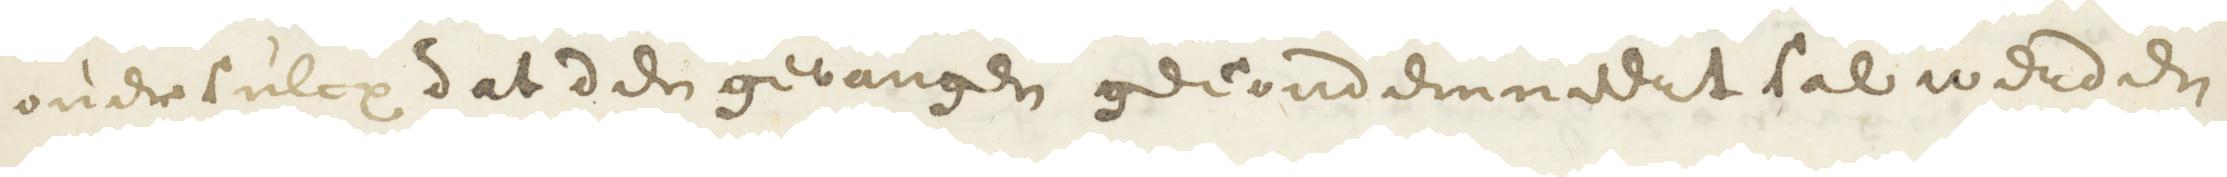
over sulcx dat den gevangen gecondemneert sal werden
